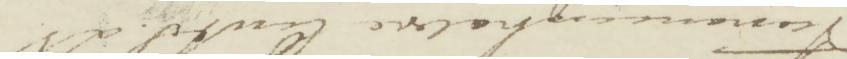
tieneneenhalve Cents. ZV.
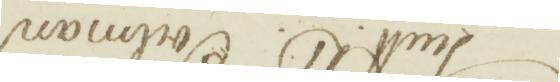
Gerrit Poelman
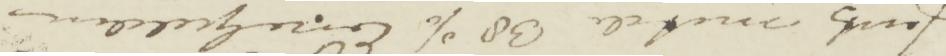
Cents met de 38 % Eebne gulden
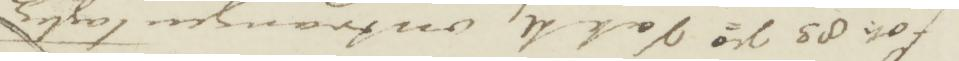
fol.i 83 V=o Vak 4, ontvangen tagtig
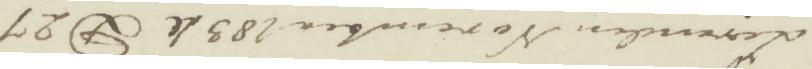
Zevenden November 1834 D27
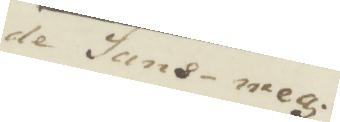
de Jans-weg.
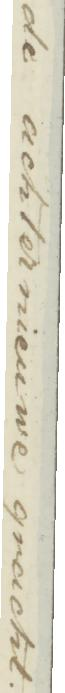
de achternieuwe gracht.
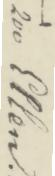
200 Ellen.
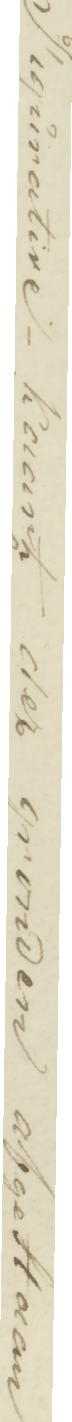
Figuratieve kaart der gronden afgestaan
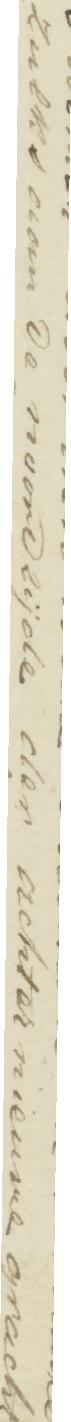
zulks aan de noordzijde der achter nieuwe gracht
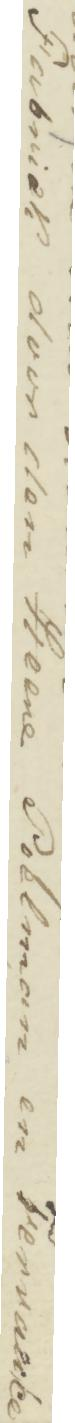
Fabriek door den Heere Poelman en Fervaecke
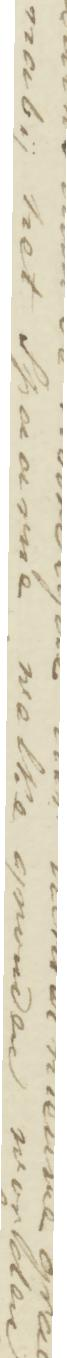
nabij het Spaarne welke gronden worden
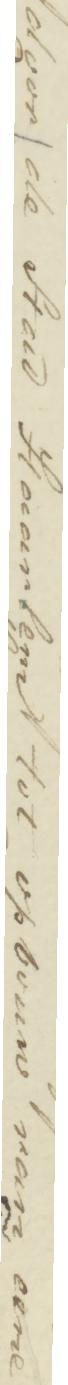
door / de Stad Haarlem tot opbouw van eene
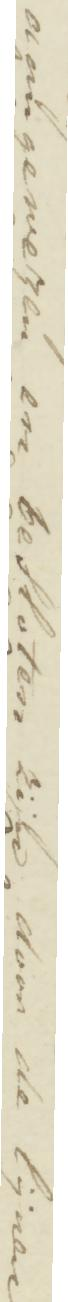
aangewezen en besloten zijn door de lijnen
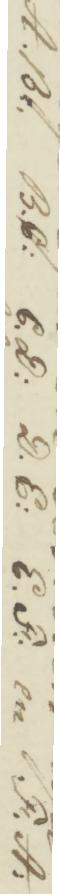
A.B. B.C: C.D: D.E: E.F: en F.A:
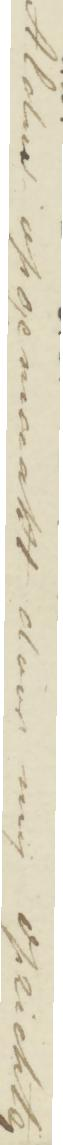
Aldus opgemaakt door mij opzichter
